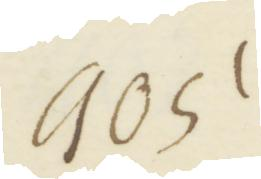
405
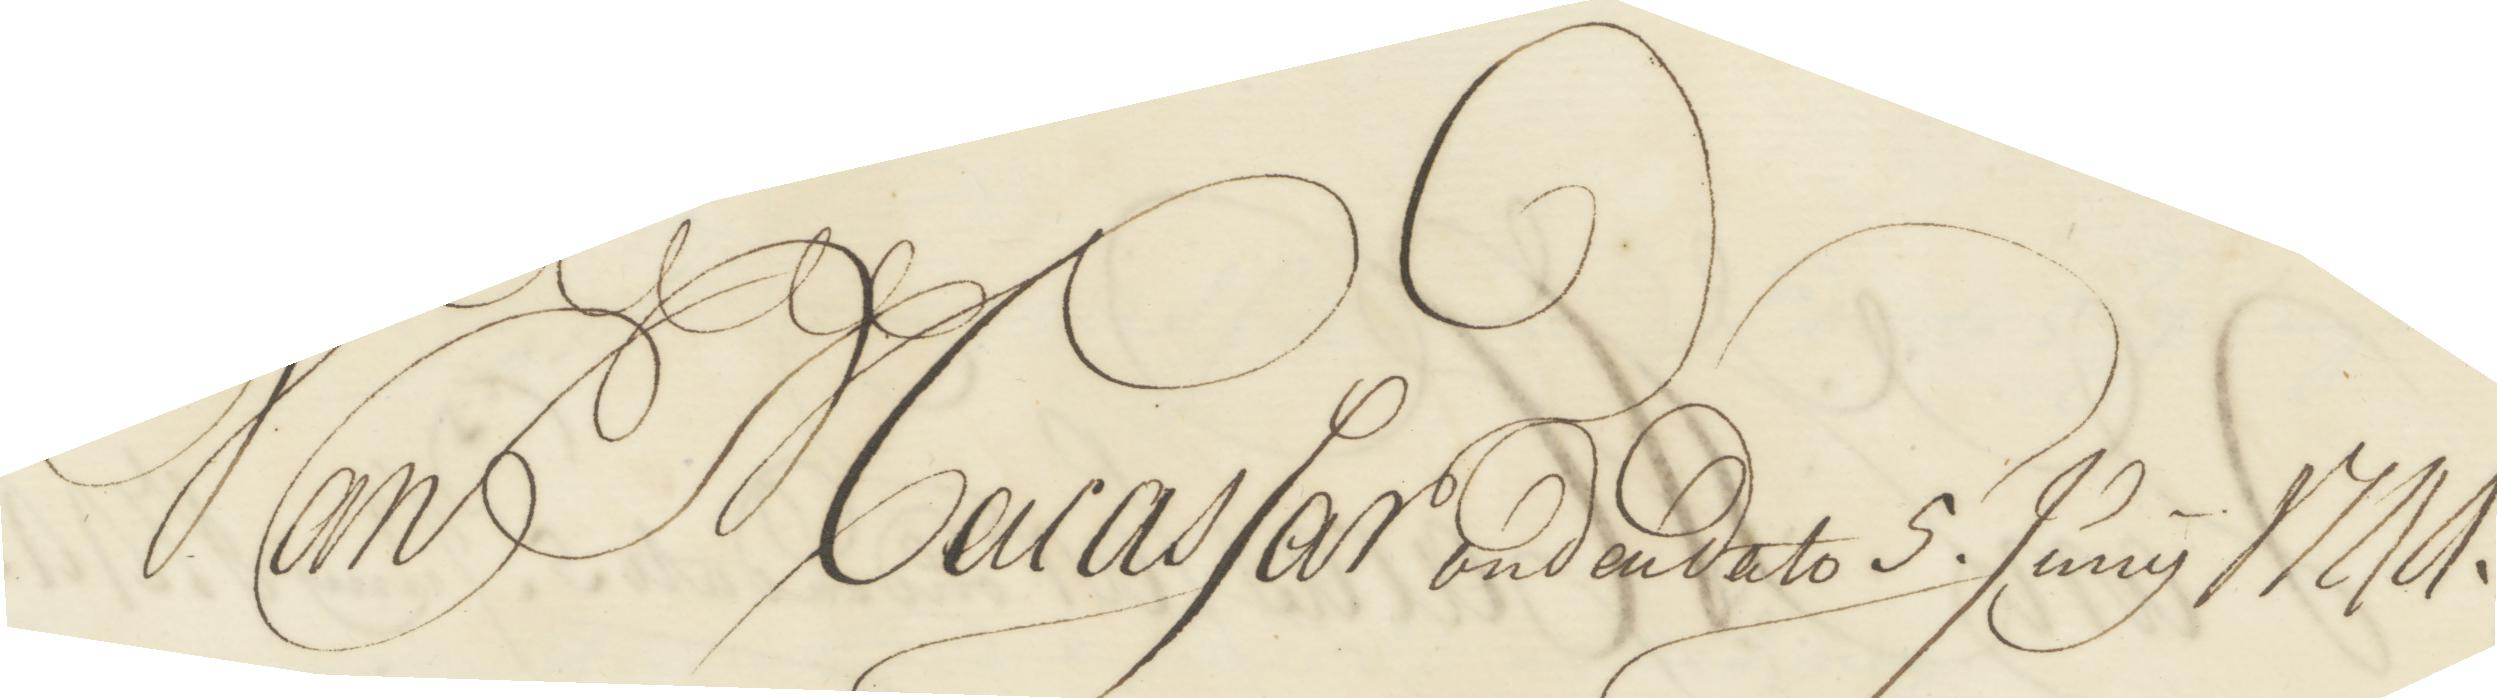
Van Macassar onde dato 5. Junij 1744.
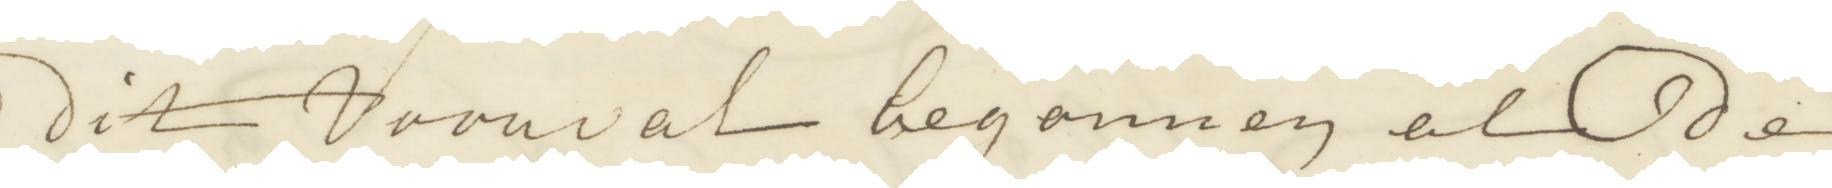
dit voorval begonnen al die
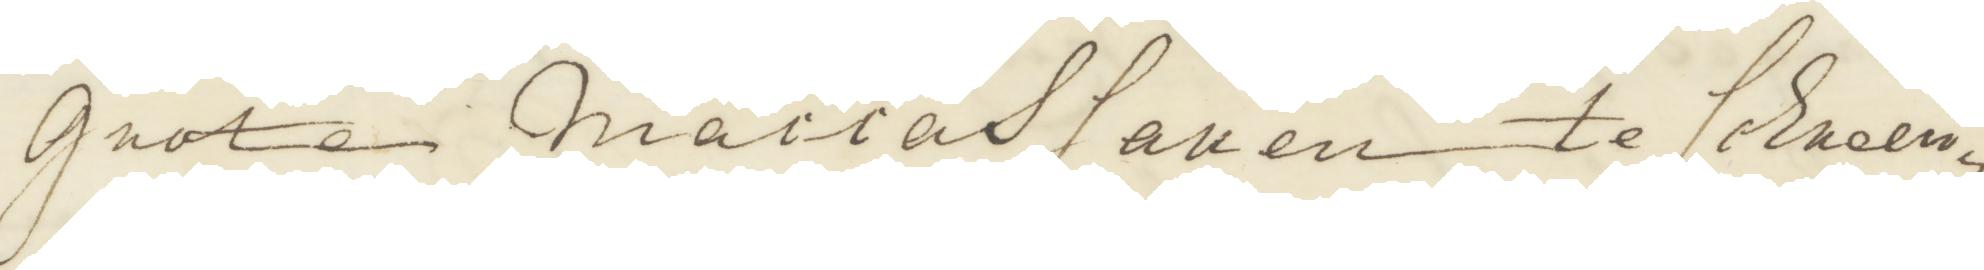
grote Maccassaren te schreeu„
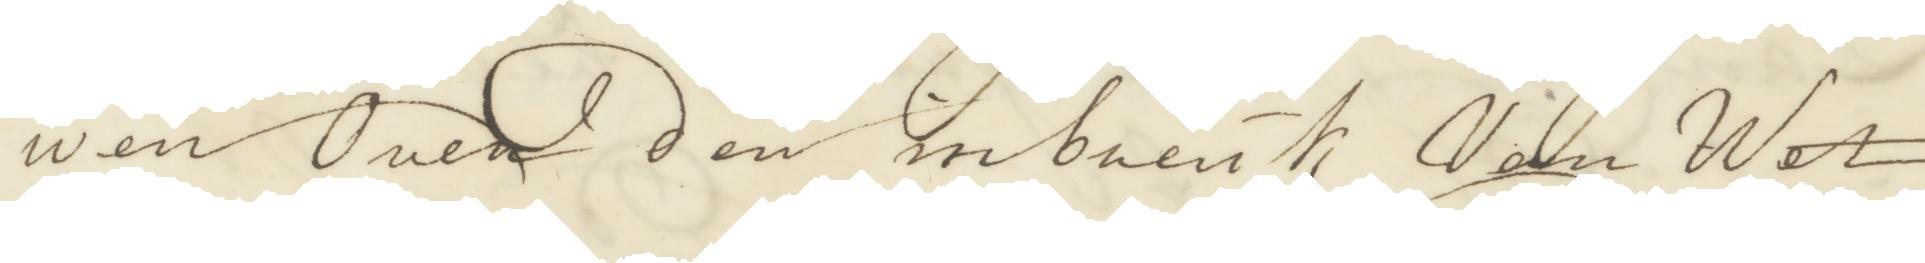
wen over den inbreuk van wet
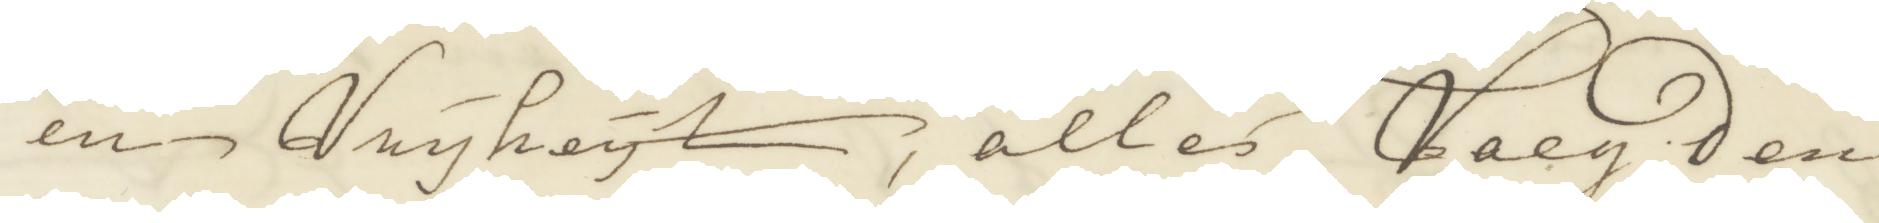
en vrijheijt, alles voeg den
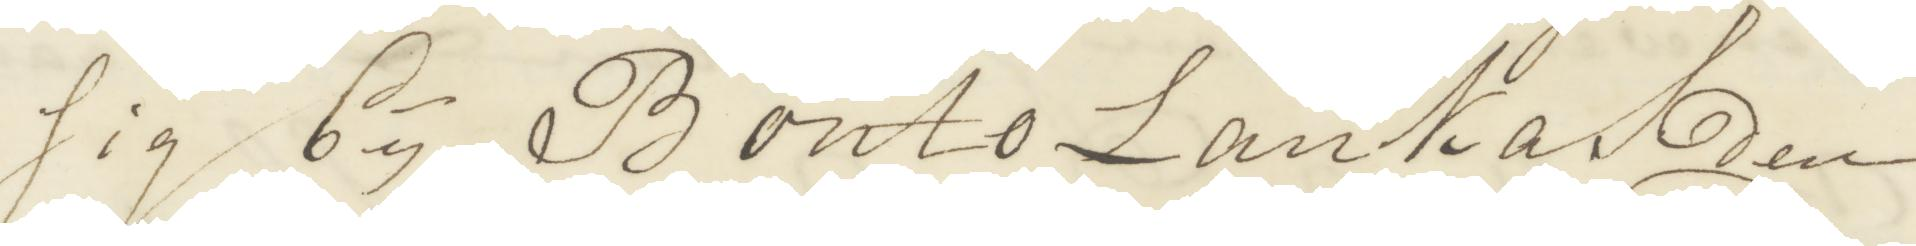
sig bij Bonto Lankas den
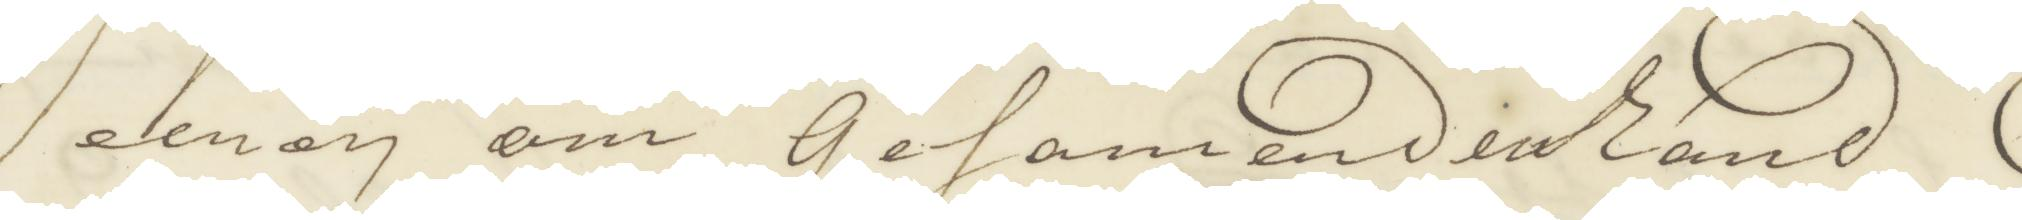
eenen om gesamenderhand
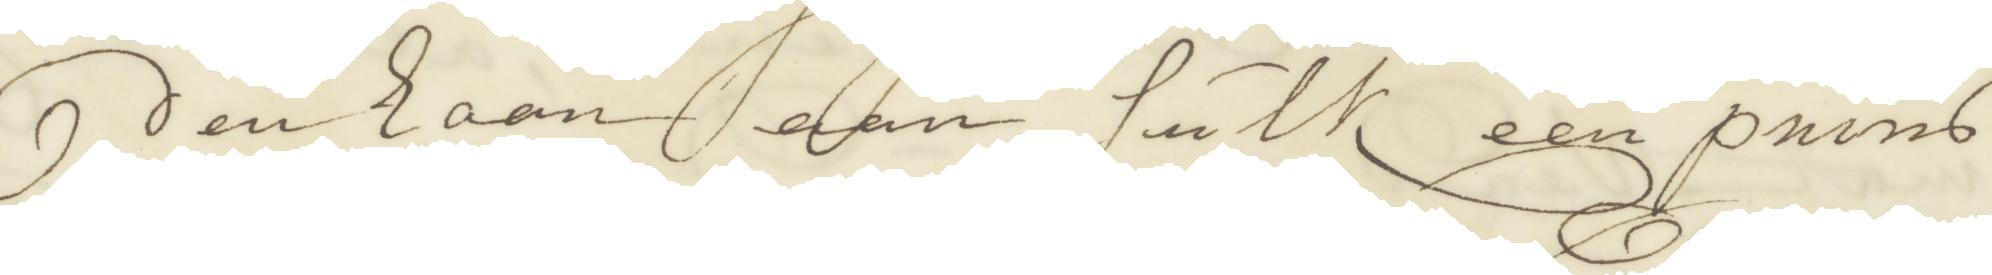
den hoon aan sulk een prins
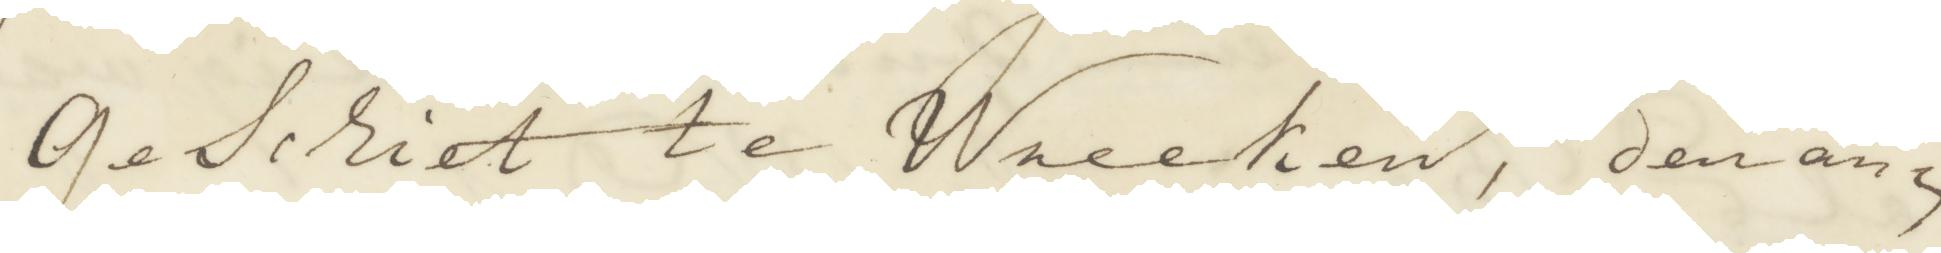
geschiet te wreeken, den an
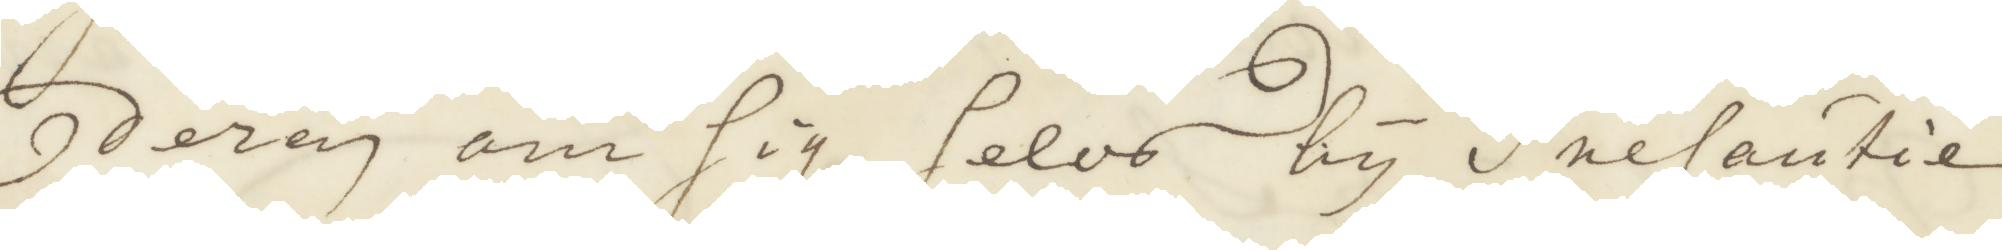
deren om sig selvs bij Precautie
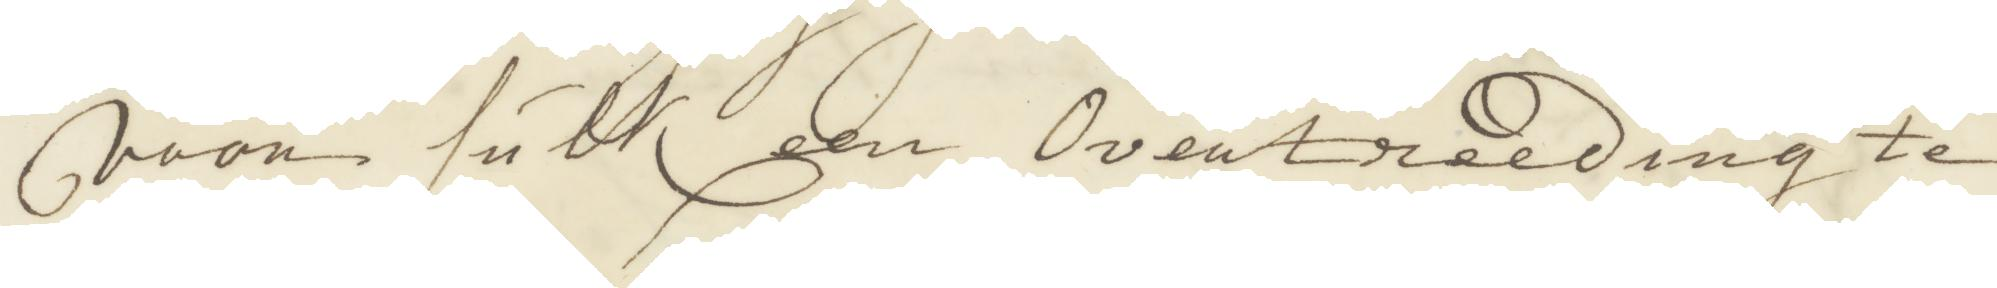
voor sulk een Overtreeding te
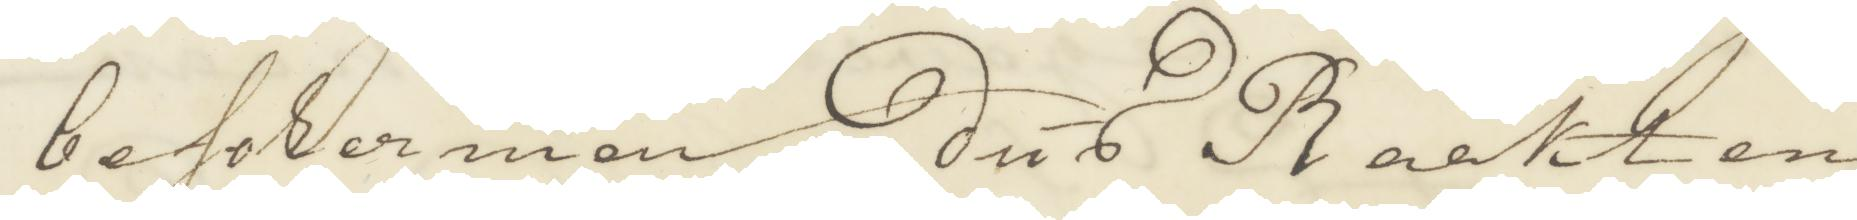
beschermen, dus Raakten
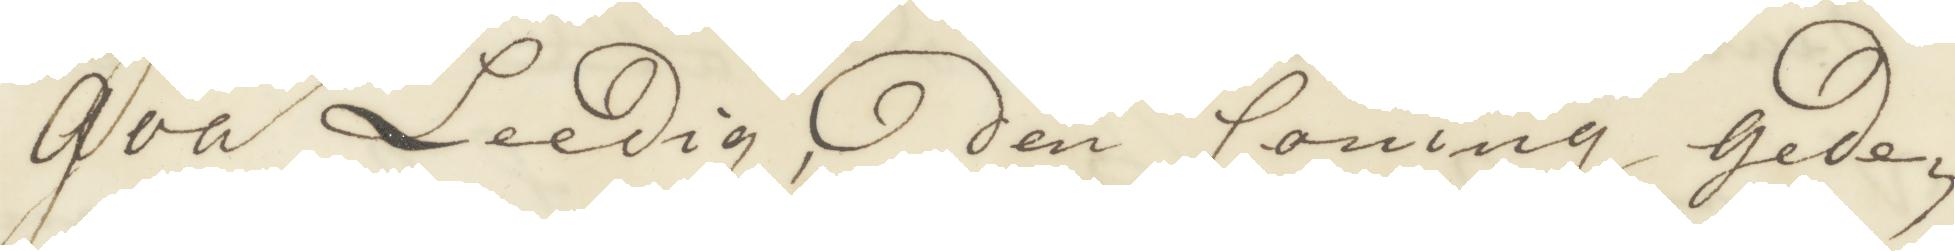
goa Leedig, den Coning gede
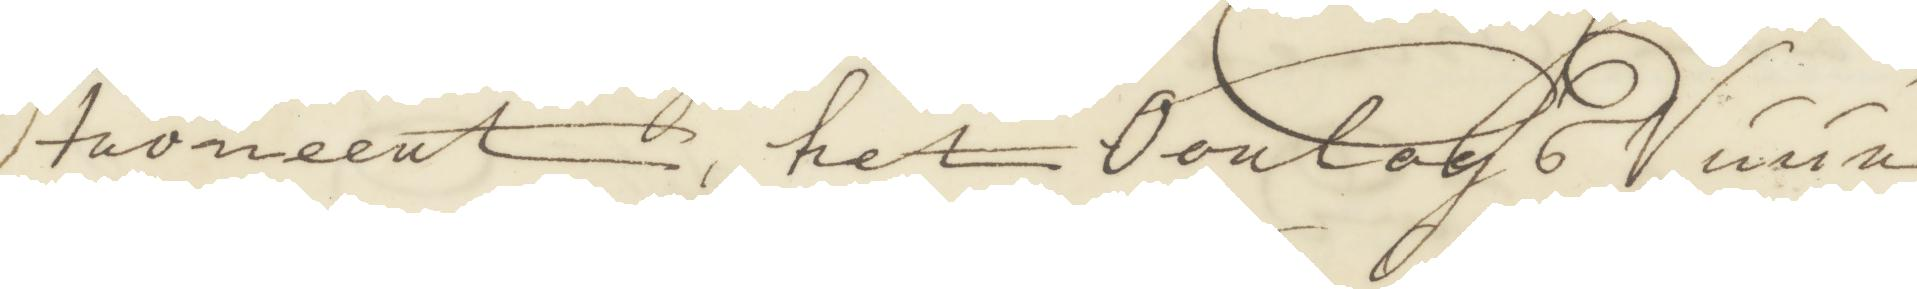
troneert, het Oorlogs Vuur
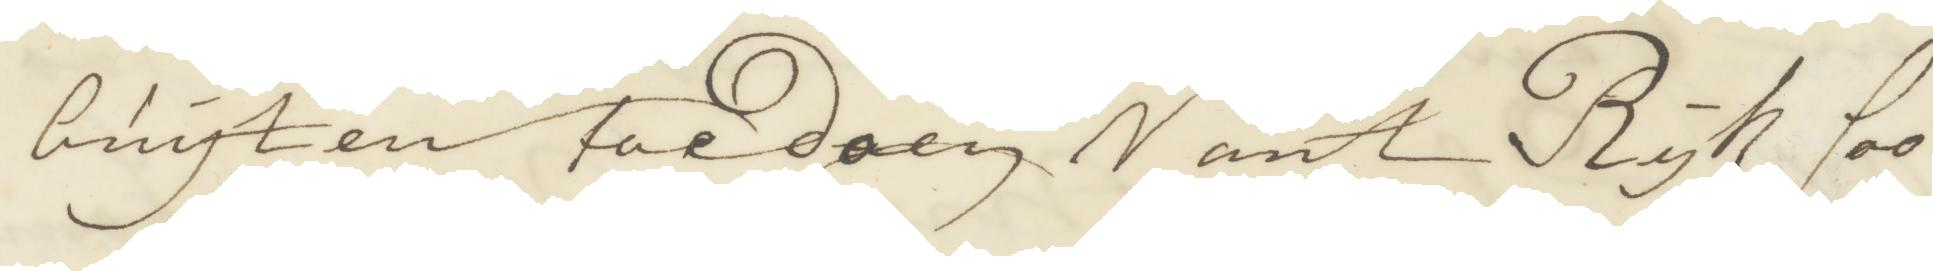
buijten toedoen van ’t Rijk soo
